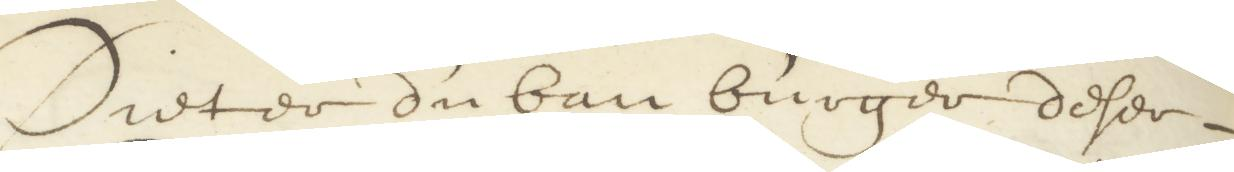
Pieter du ban burger deser —
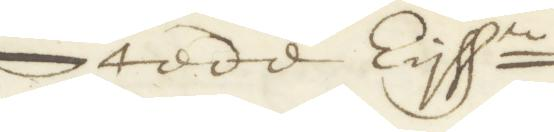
Stede Eijss=r
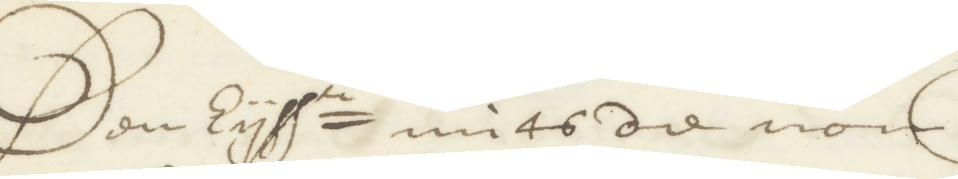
Den Eijss=r mits de non
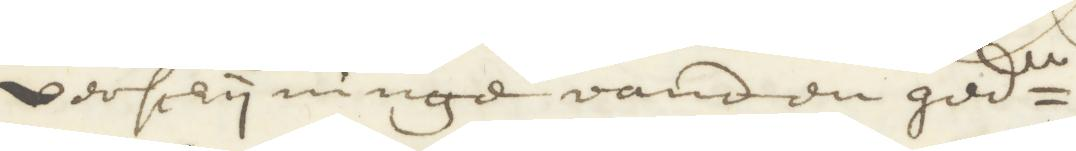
verschijninge vanden ged=e
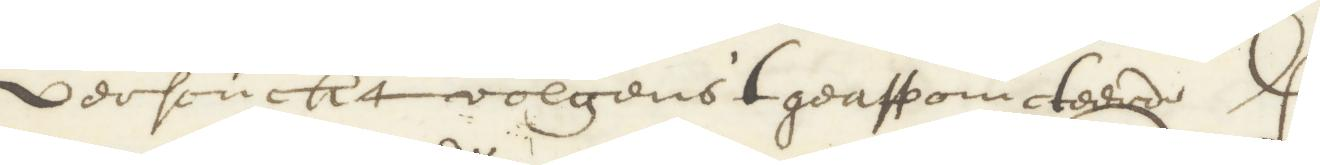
versouckt volgens 't geappoincteerde
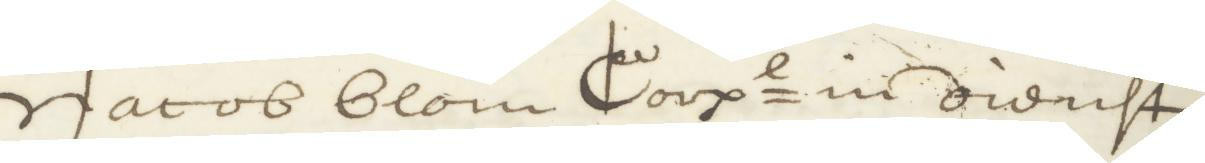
Jacob blom Corp=l in dienst
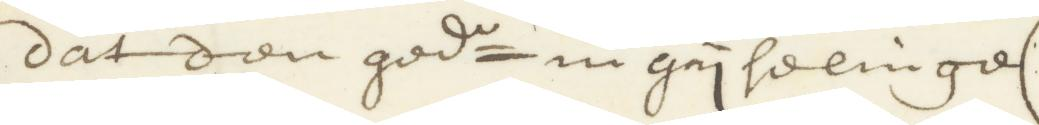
dat den ged=e in gijselinge
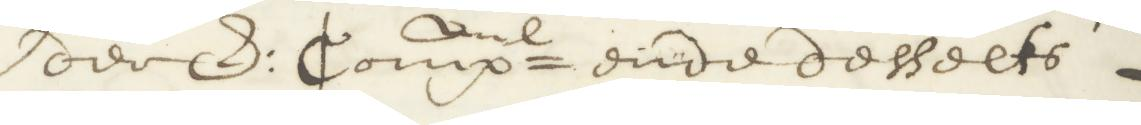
der E: Comp=e ende desselfs —
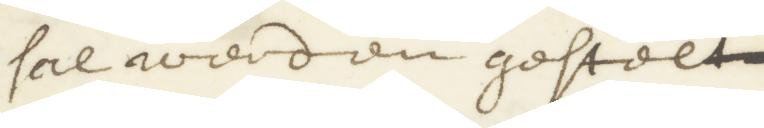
sal werden gestelt
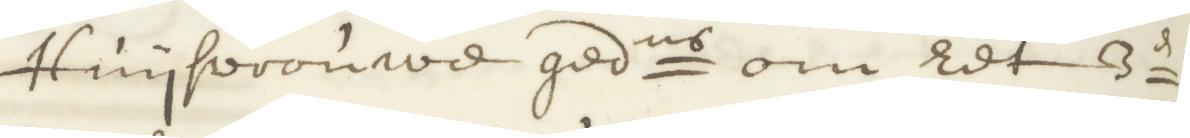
Huijsvrouwe ged=ns om het 3=en
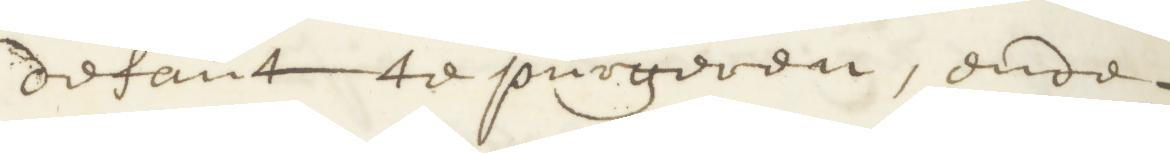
defaut te purgeren, ende —
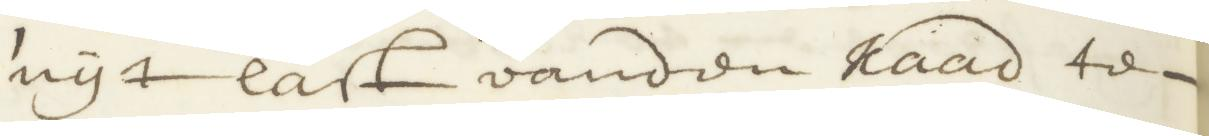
uijt last vanden Raad te —
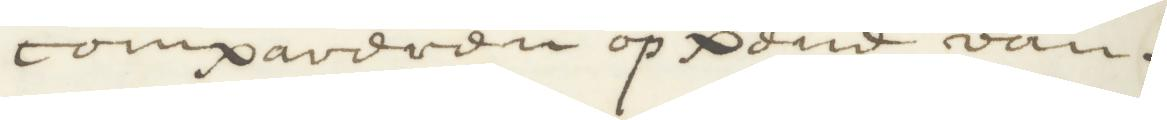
compareren op pene van —
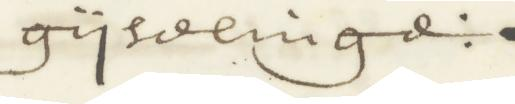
gijselinge: —
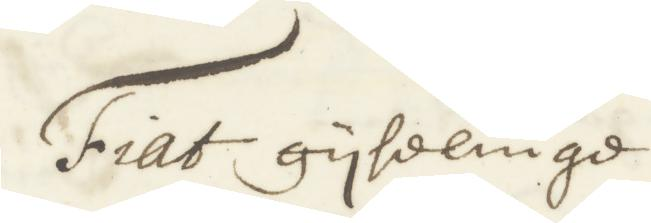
Fiat gijselinge
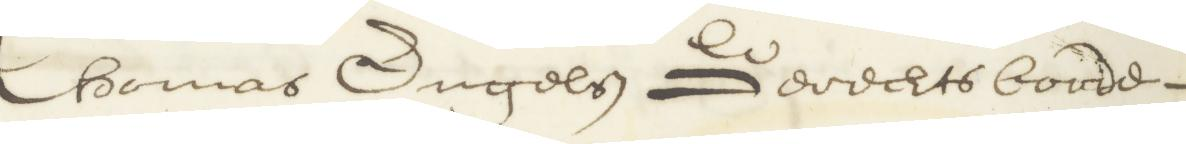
Thomas Engels Gerechts boode —
